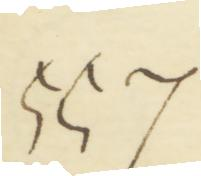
557
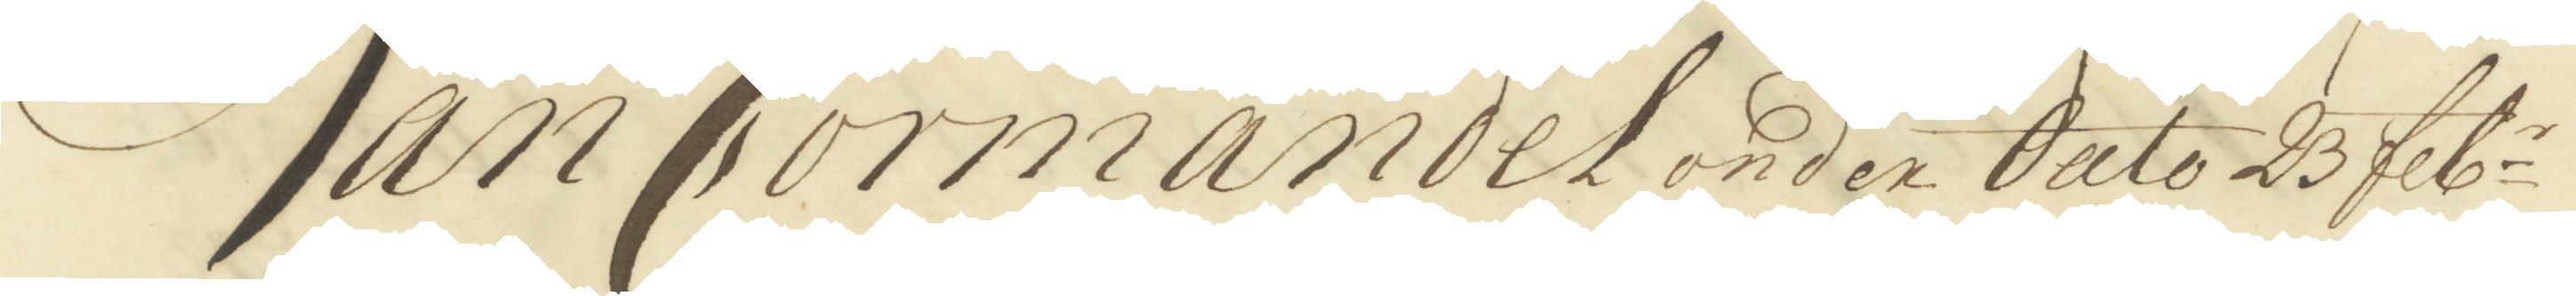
Van Cormandel onder dato 23 feb=r
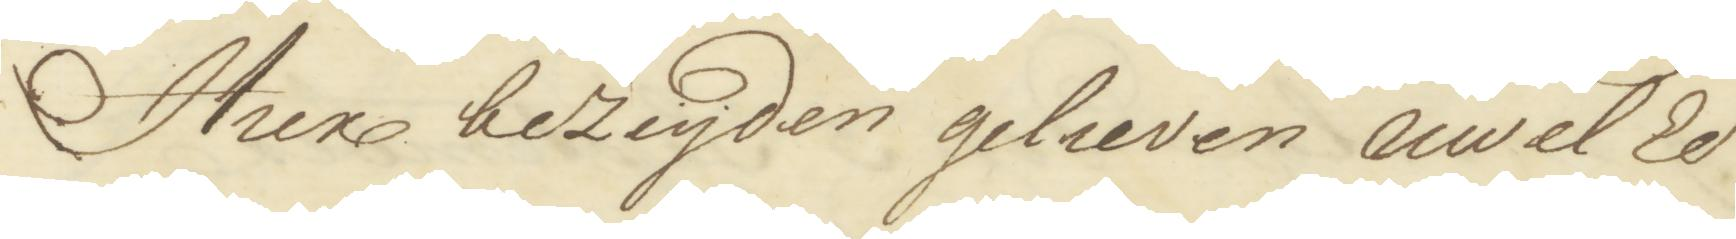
Hier bezeijden gelieven uwel Ed
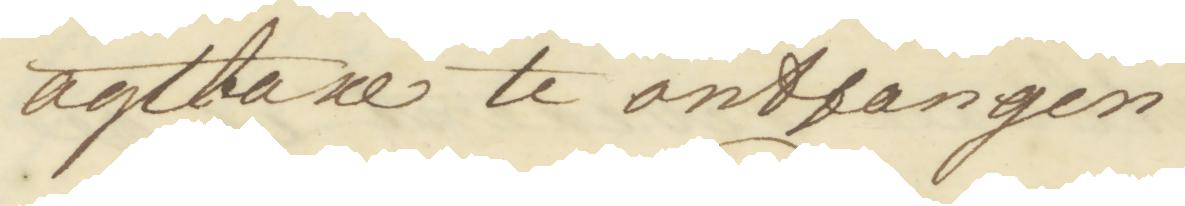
agtbare te ontfangen
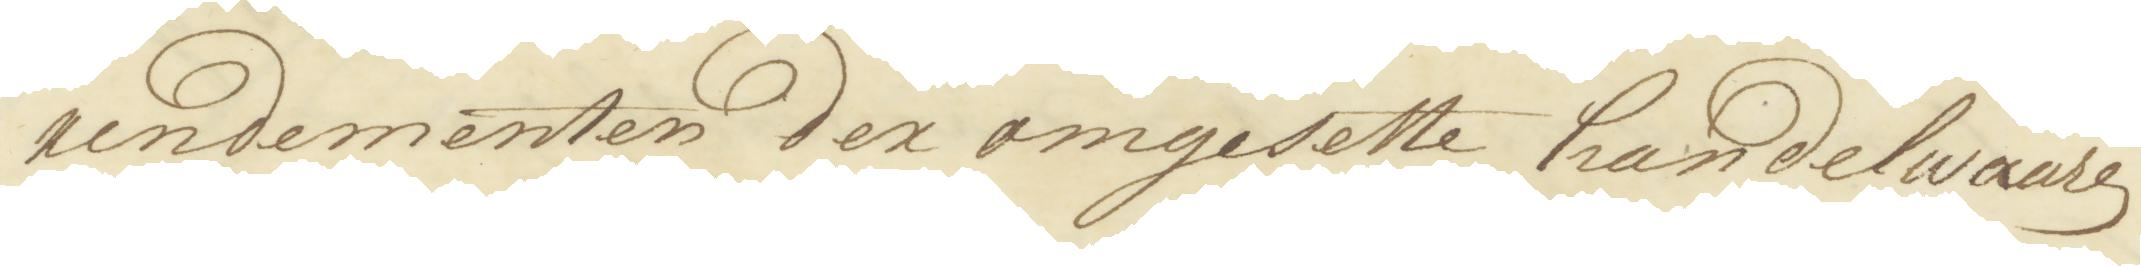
rendementen der omgesette handelwaaren
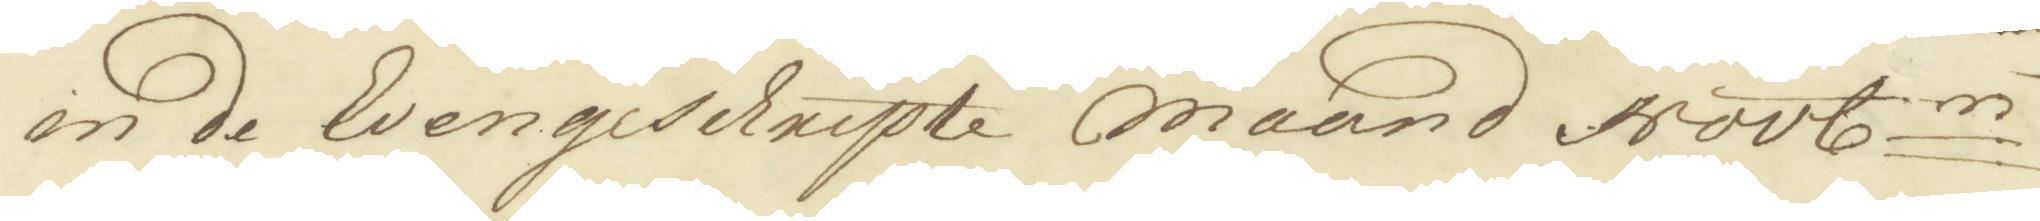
in de Evengeschripte maand Novb=r
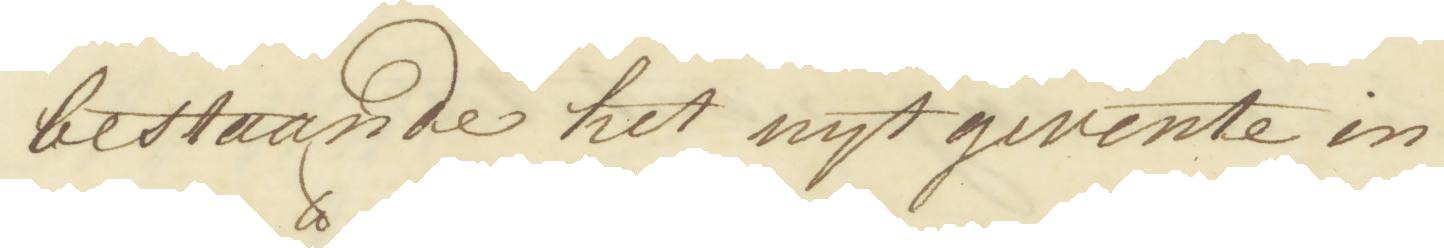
bestaande het uyt gevente in
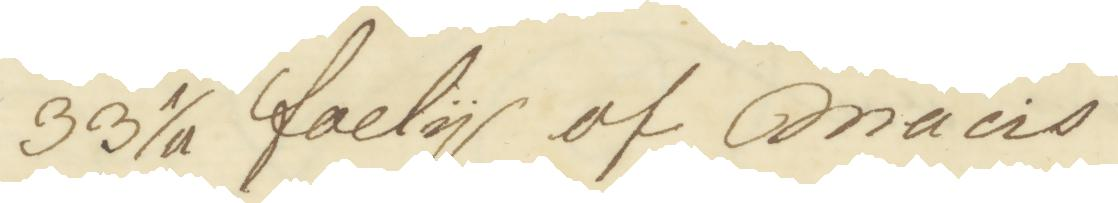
33¼ lb foelij of macis
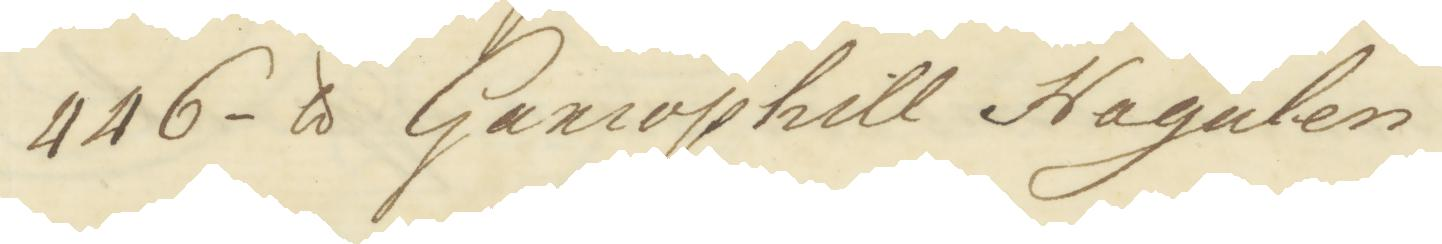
446 — lb Gariophill Nagulen
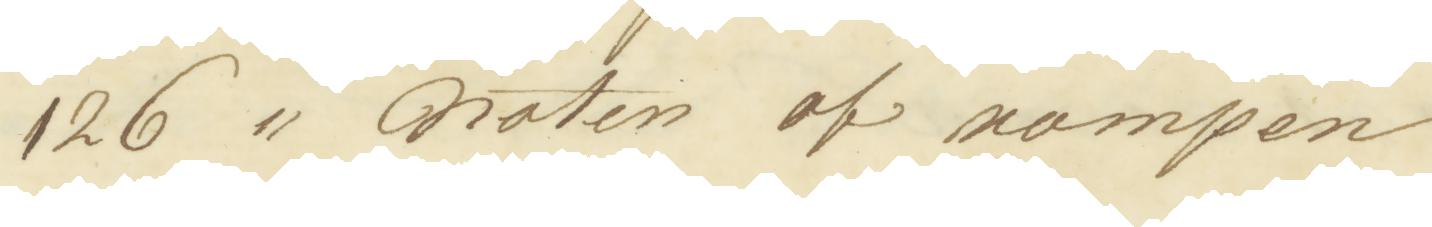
126 „ noten of rompen
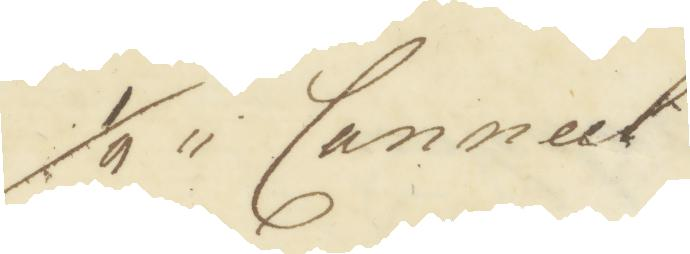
¼ „ Canneel
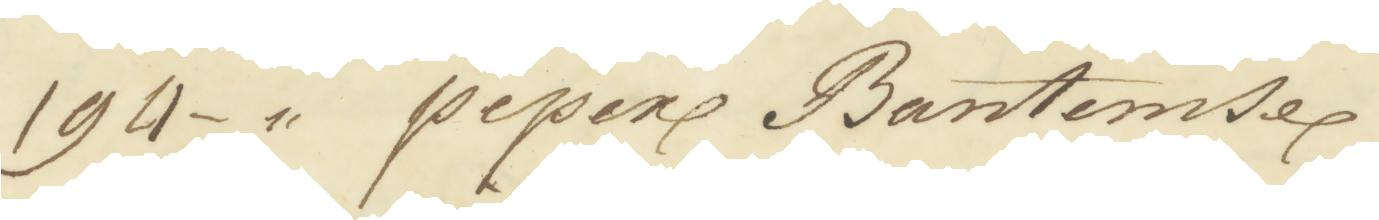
194 — „ peper Bantemse
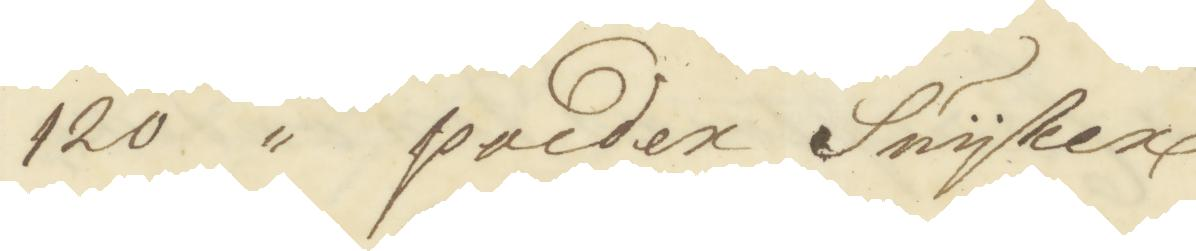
120 „ poeder suijker
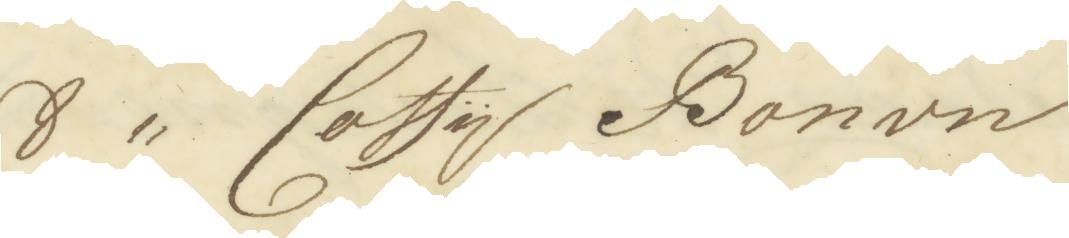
8 „ Coffij Bonen
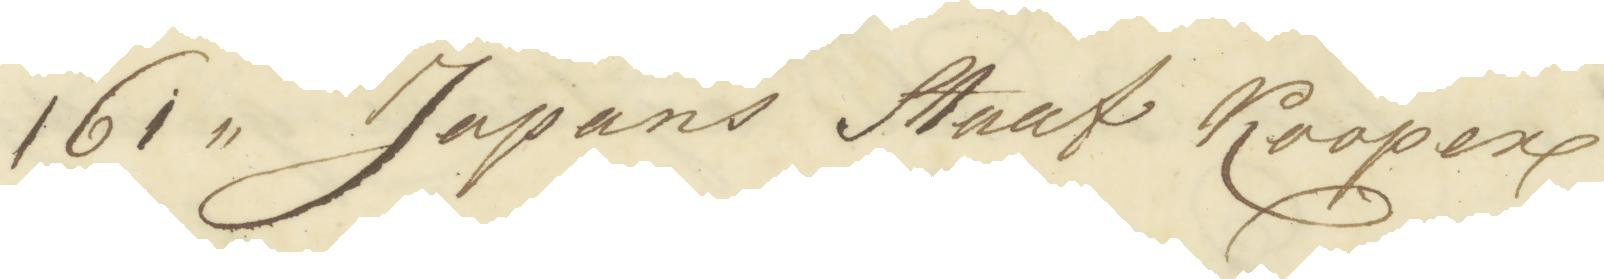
161 „ Japans staaf Kooper
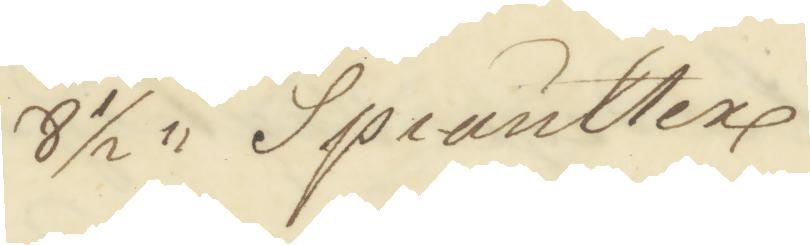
8½ „ spraulter
